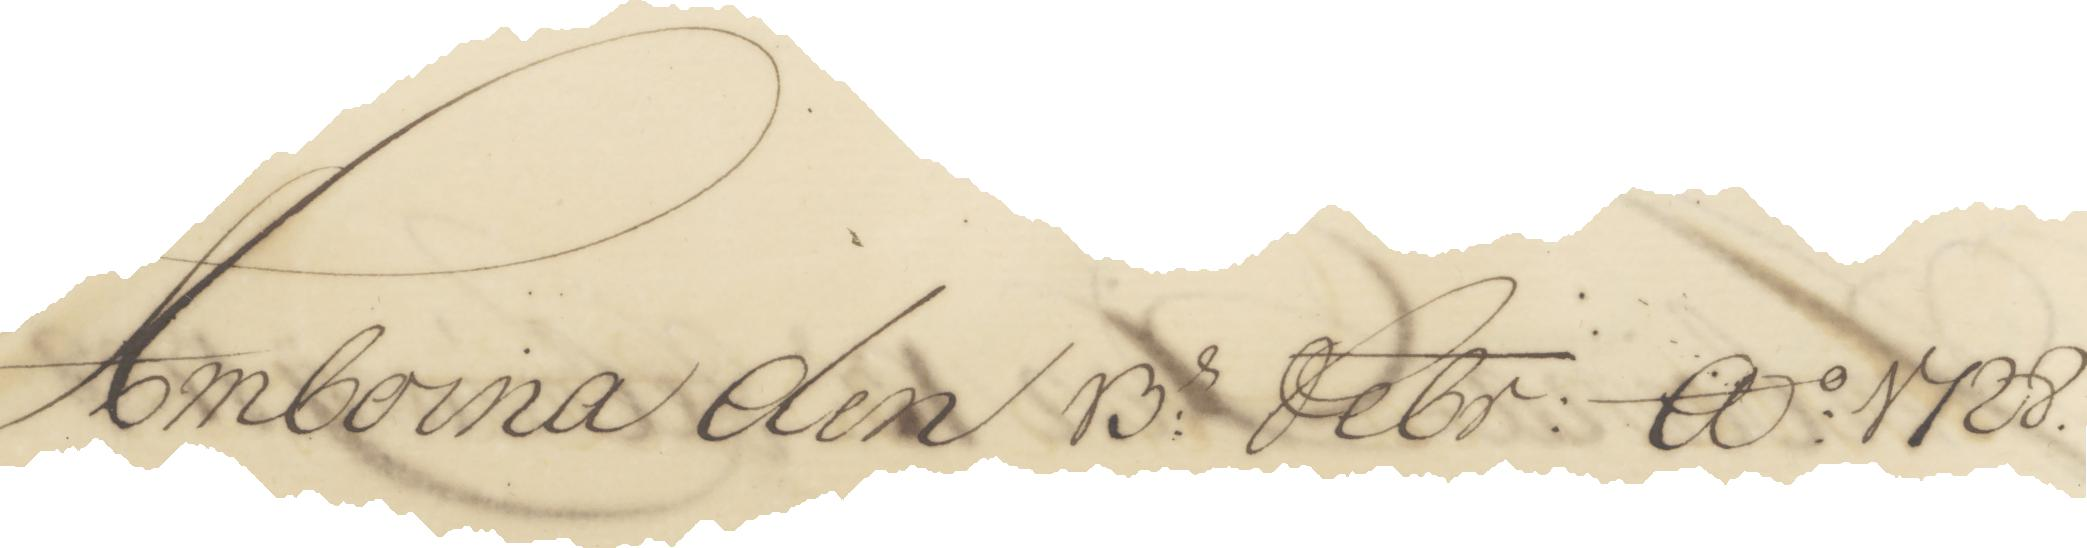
Amboina den 13:en Febr: A:o 1728.
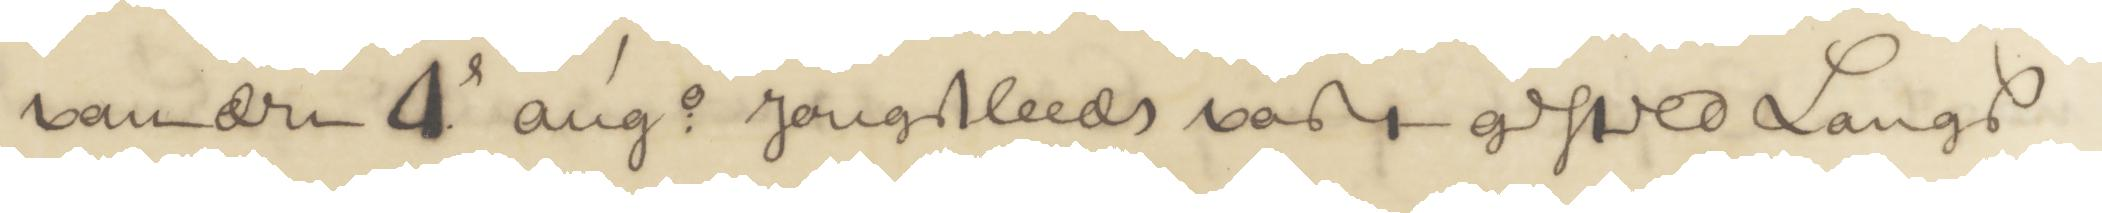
van den 4.e aug:o jongstleeden vast gesteld langs
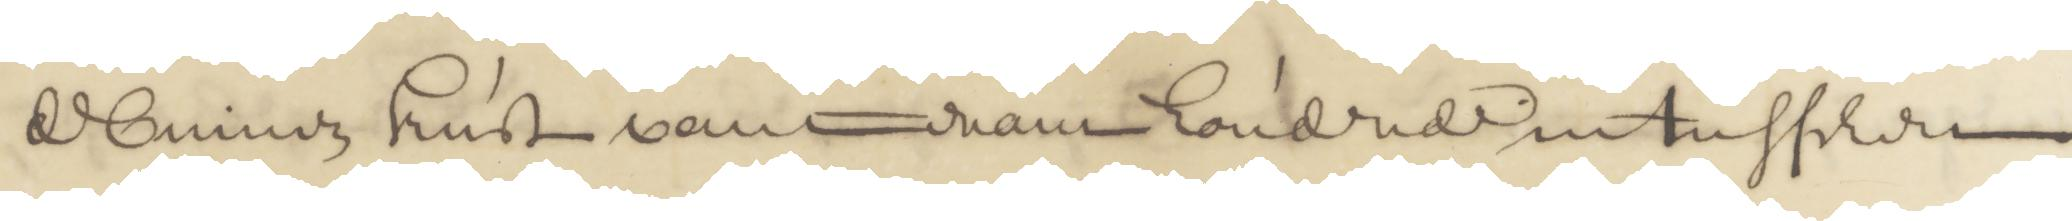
de binnen kust van ceram houdende intusschen
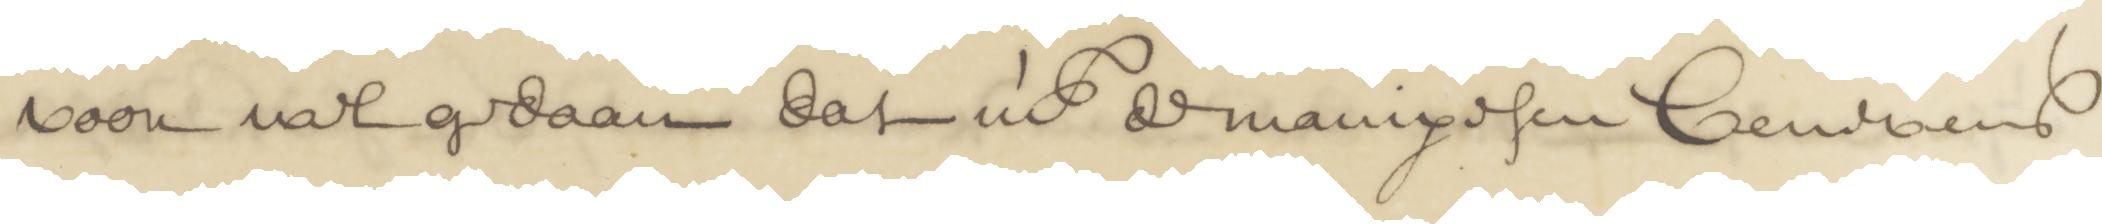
voor wel gedaan dat uE de manipesen benevens
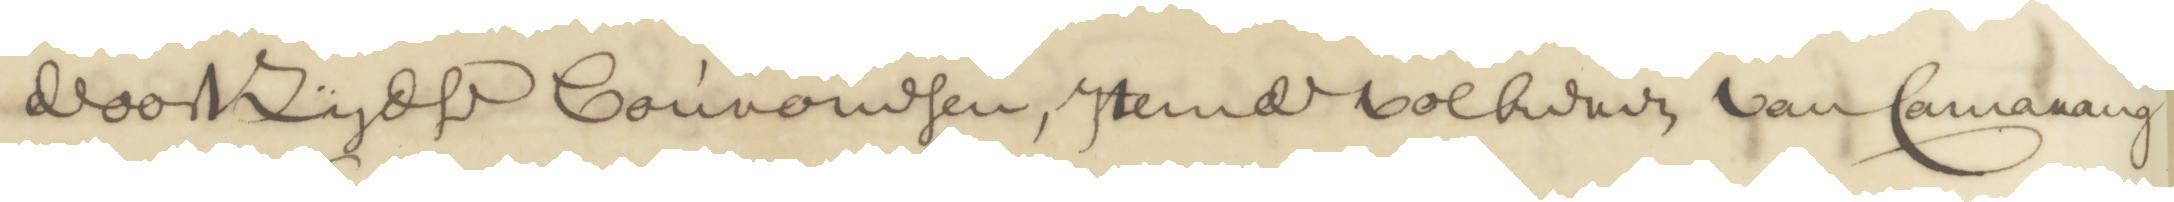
de oost Zijdse Bouronesen, jtem de volkeren van Camarang
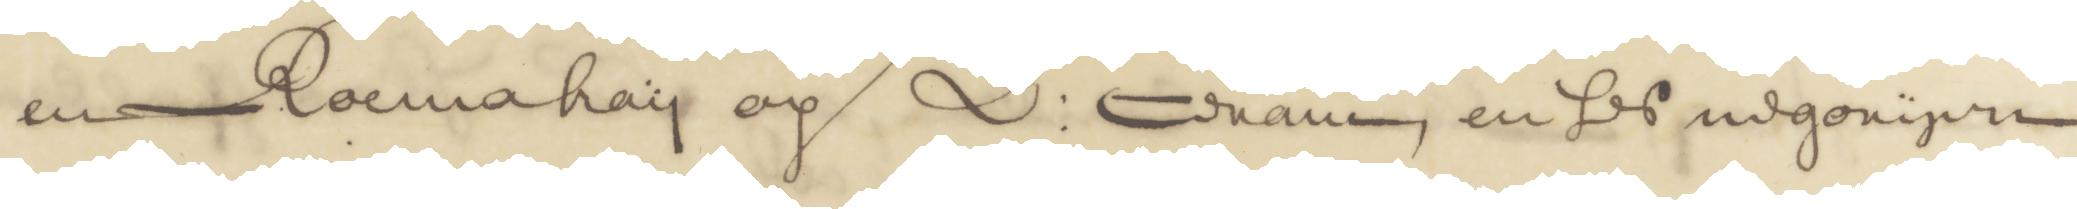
en Roemakaij op Z: ceram, en ses negorijen
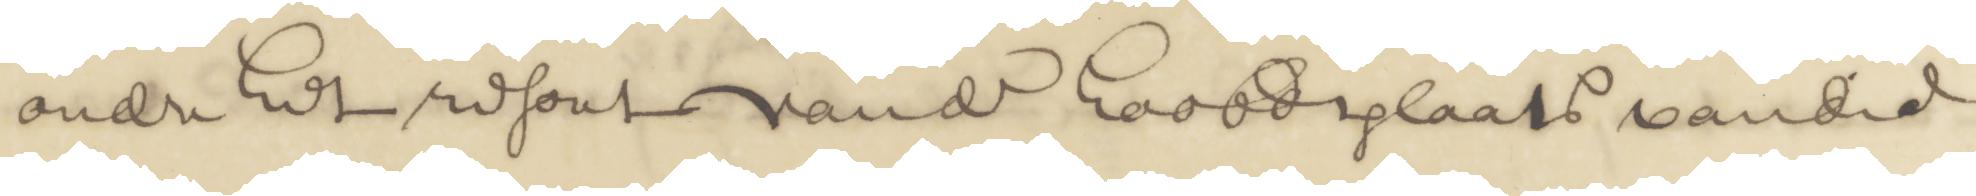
onder het resort van de hoofdplaats van die
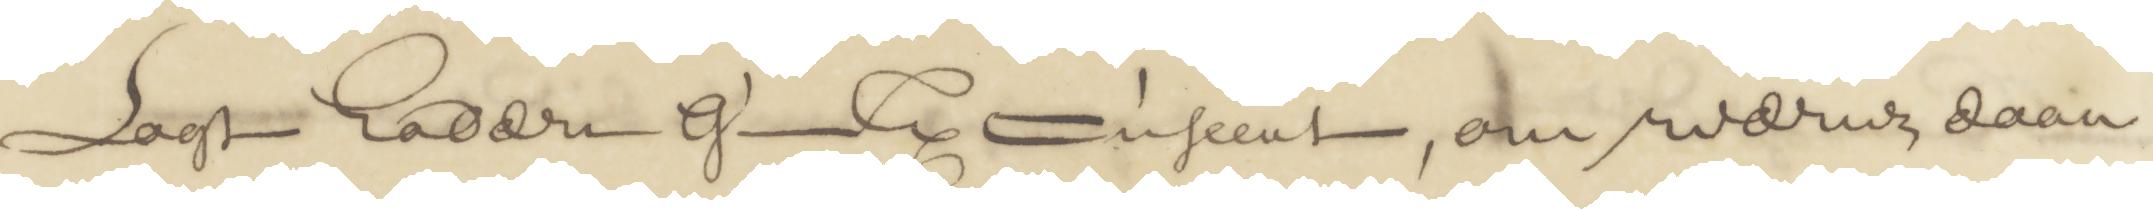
logt hadden g’Excuseert, om redenen daar
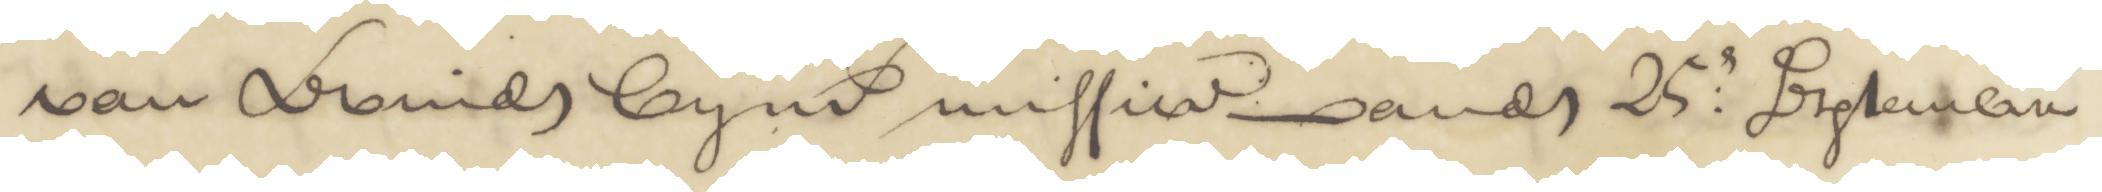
van bevinden bij uE missive vanden 25:e september
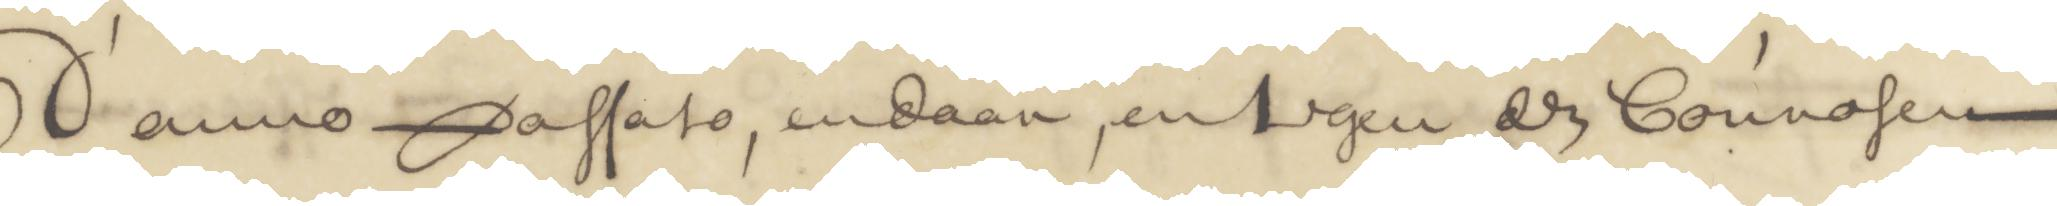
d’anno passato, en daar, en tegen den Bourosen
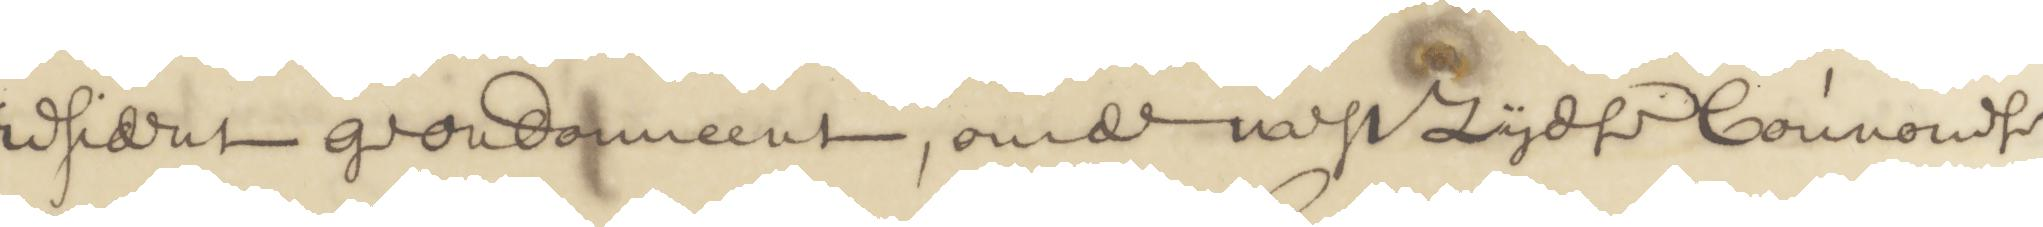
resident geordonneert, om de west Zijdse Bouronesen
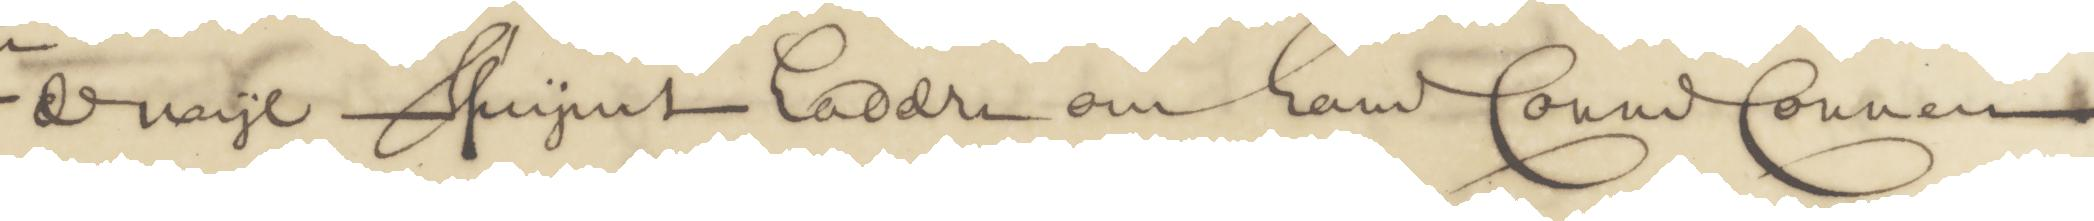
dewijl versuijmt hadden om hare Conne Connen
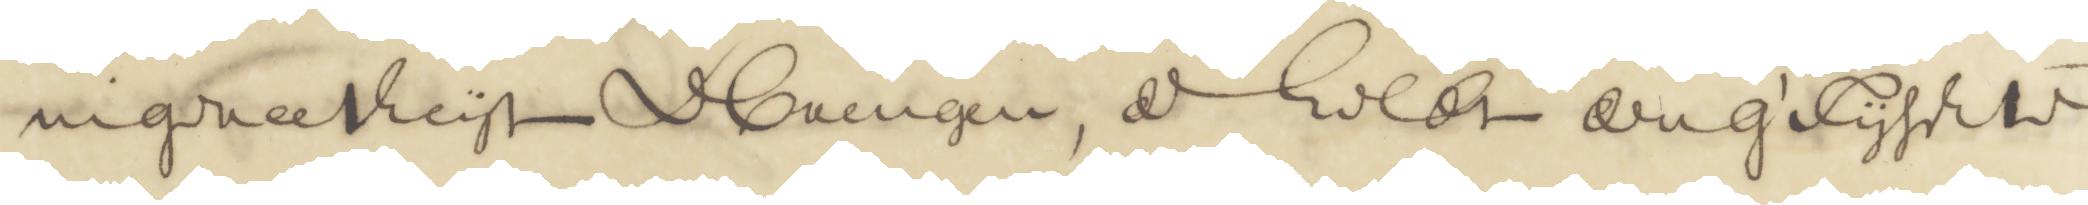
in gereetheijt tebrengen, de helft den g’Eijschte
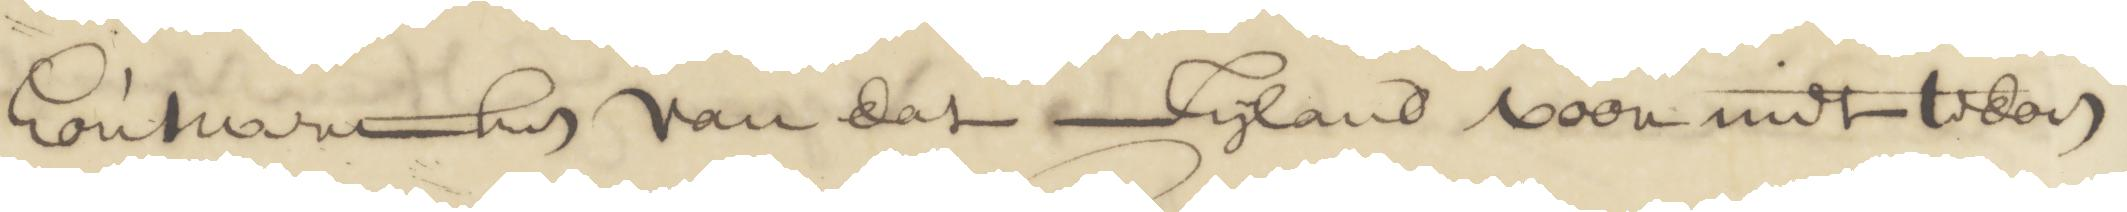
houtwercken van dat Eijland voor niet te doen
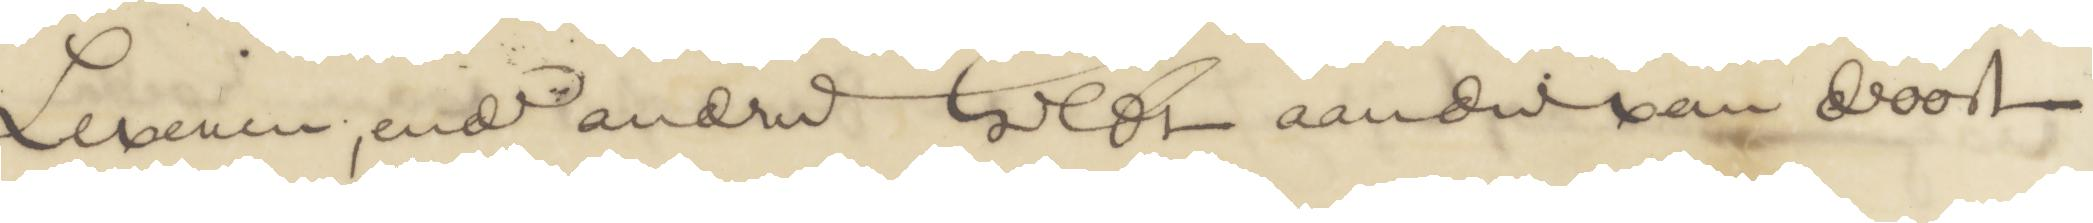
leveren, ende andere helft aan die van deoost
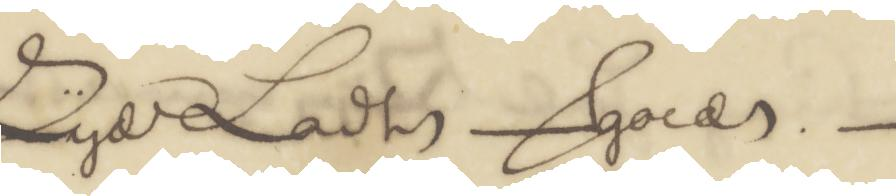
Zijde Laeten vergoeden. -
